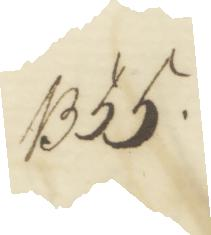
1355.
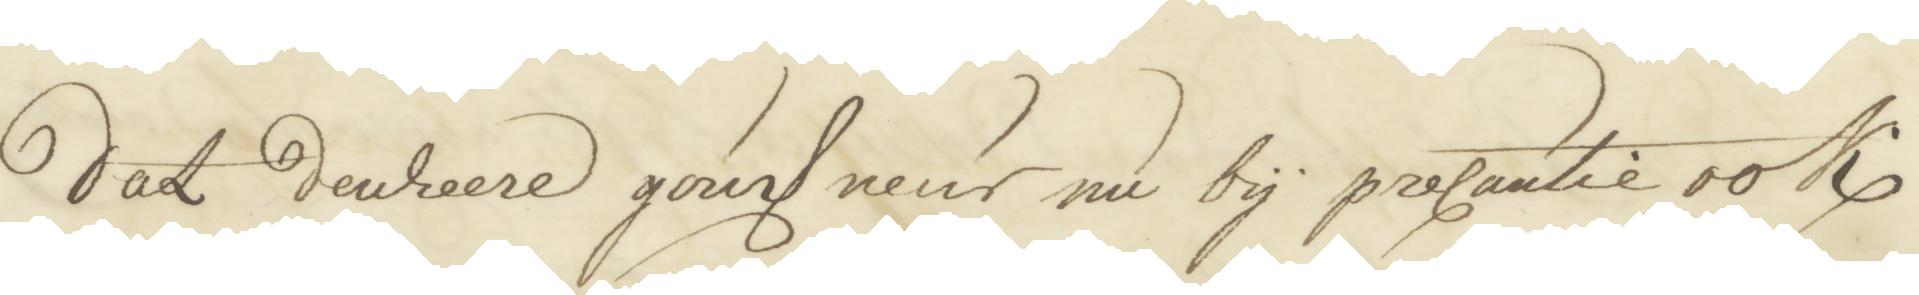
dat den heere gouverneur nu bij precautie ook
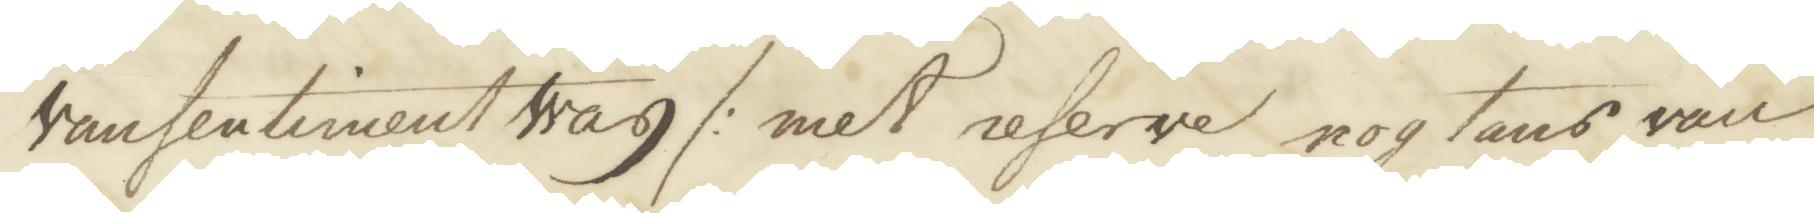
van sentiment was /:met reserve nog tans van
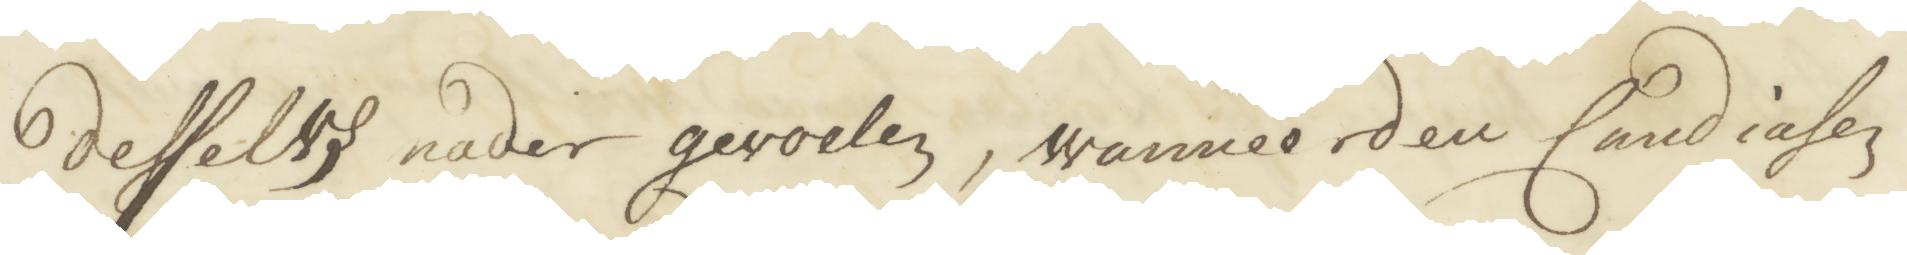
desselvs nader gevoelen, wanneer den Candiasen
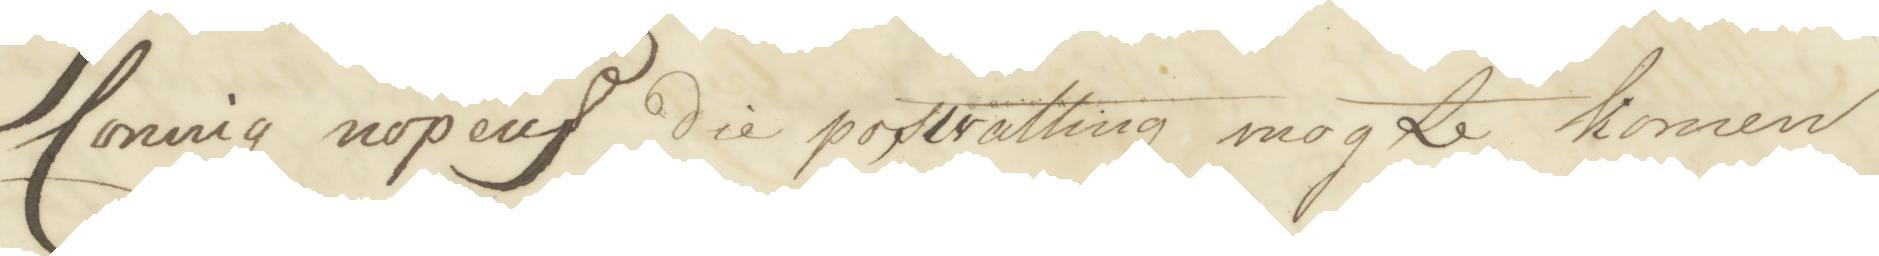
Coning nopens die postvatting mogte komen
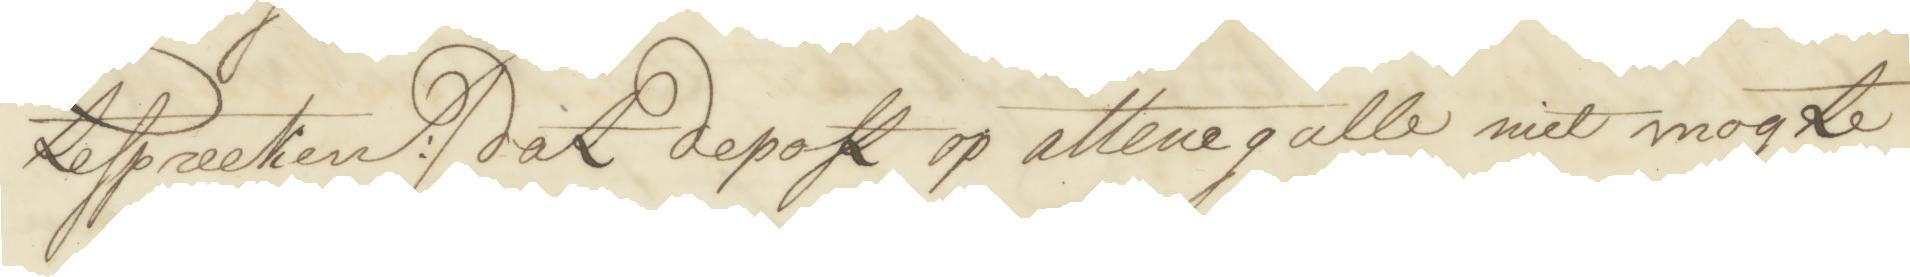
tespreeken:/ dat de post op attenegalle niet mogte
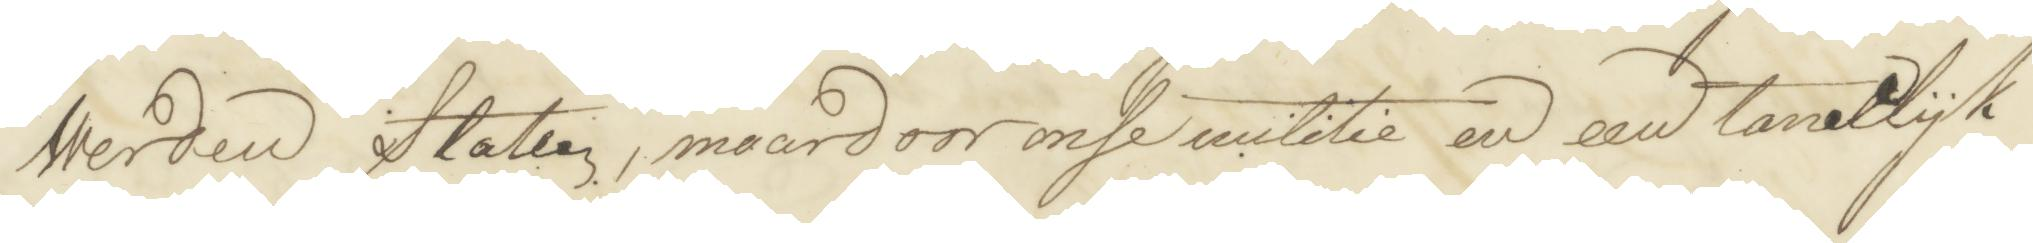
Werden verlaten, maar door onse militie en een tanellijk
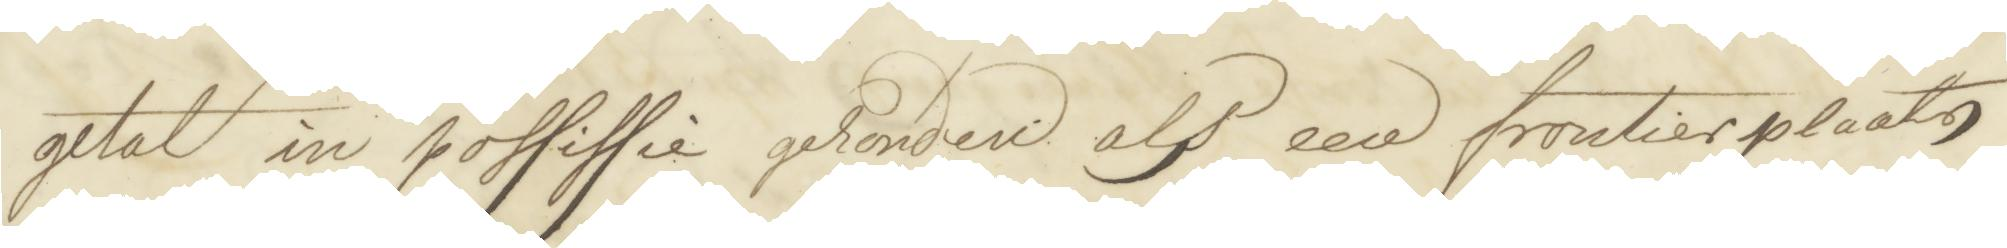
getal in possissie gehouden als een frontier plaats
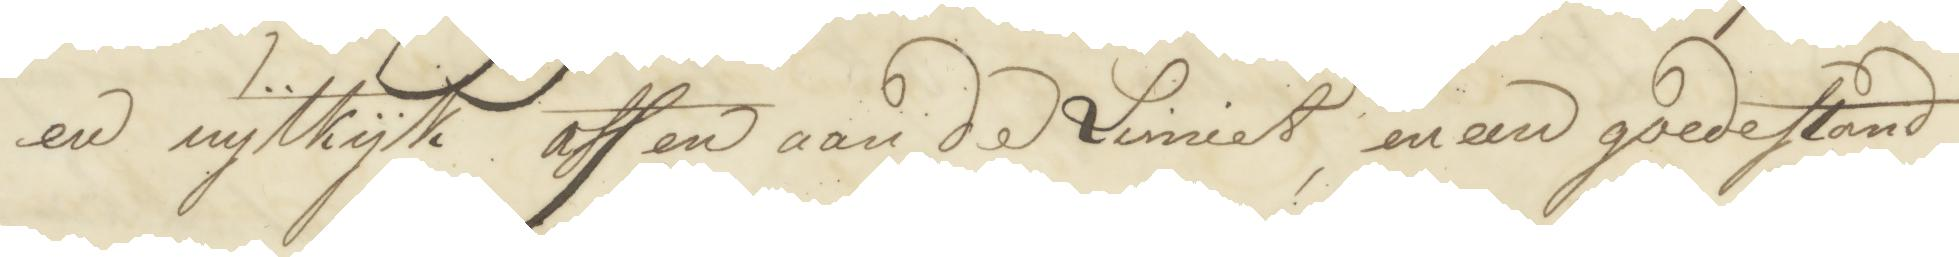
en uijtkijk off en aan de Limiet, en een goede stand
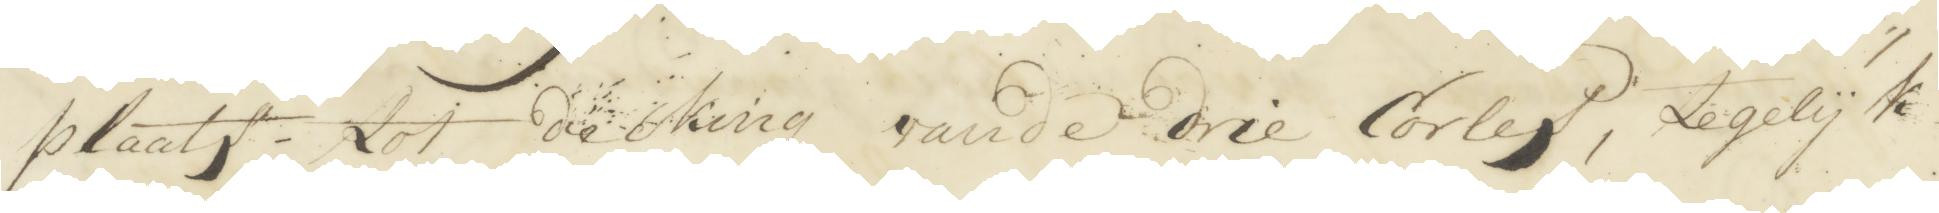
plaats tot decking van de drie Corles, tegelijk
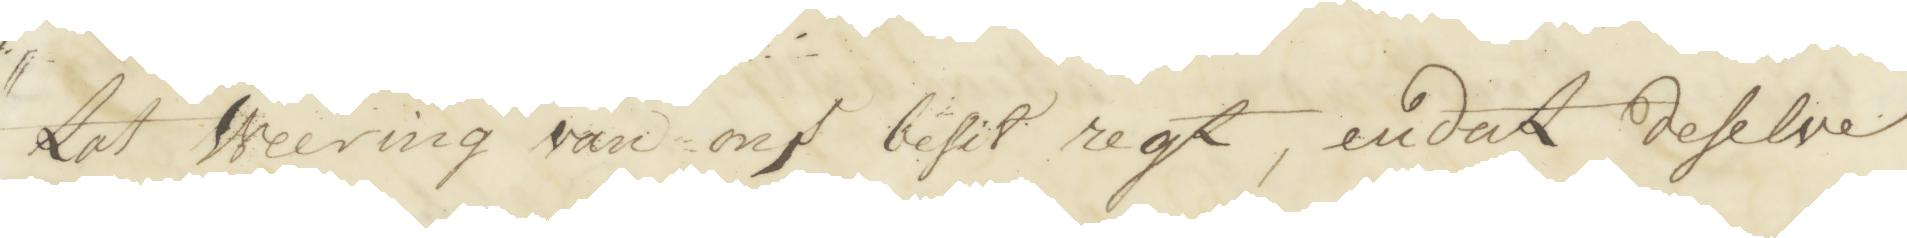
tot Weering van ons besit regt, en dat deselve
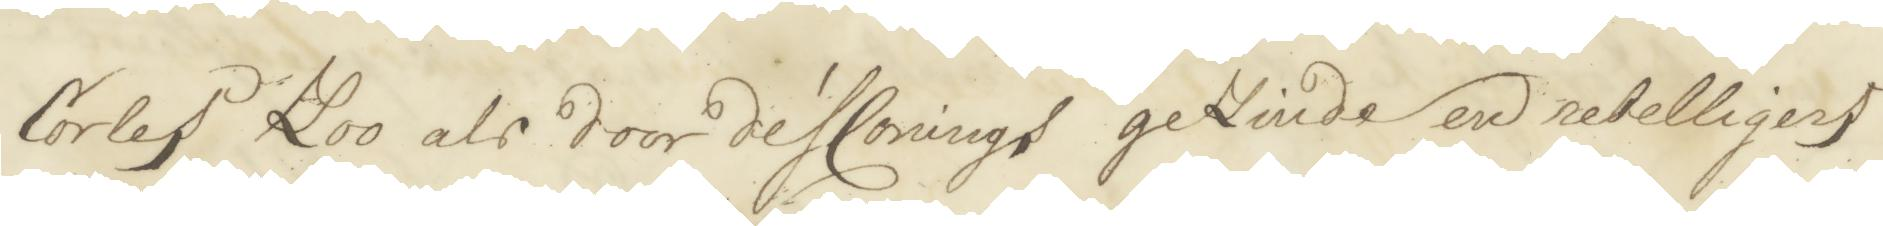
Corles zoo als door de 'sConings gezinde en rebelligers
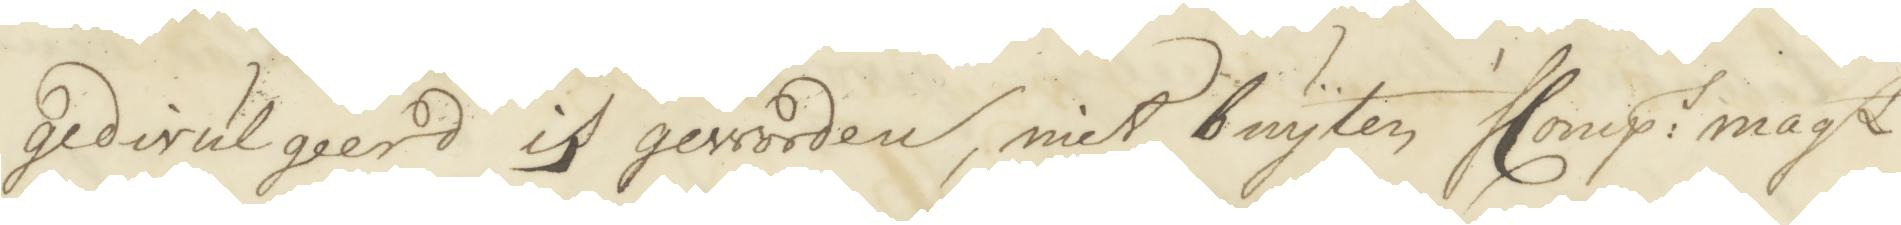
gedivulgeerd is geworden, niet buijten 'sComp:s magt
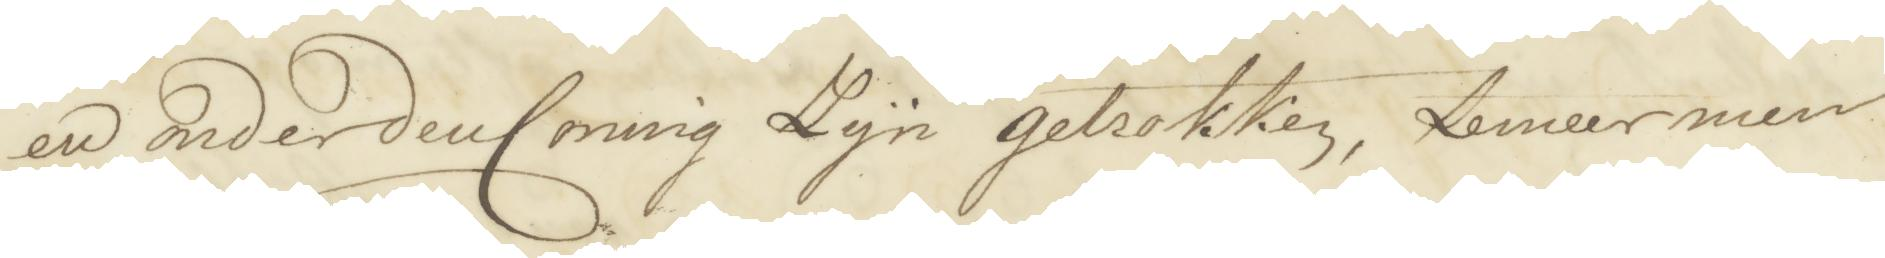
en onder den Coning zijn getrokken, temeer men
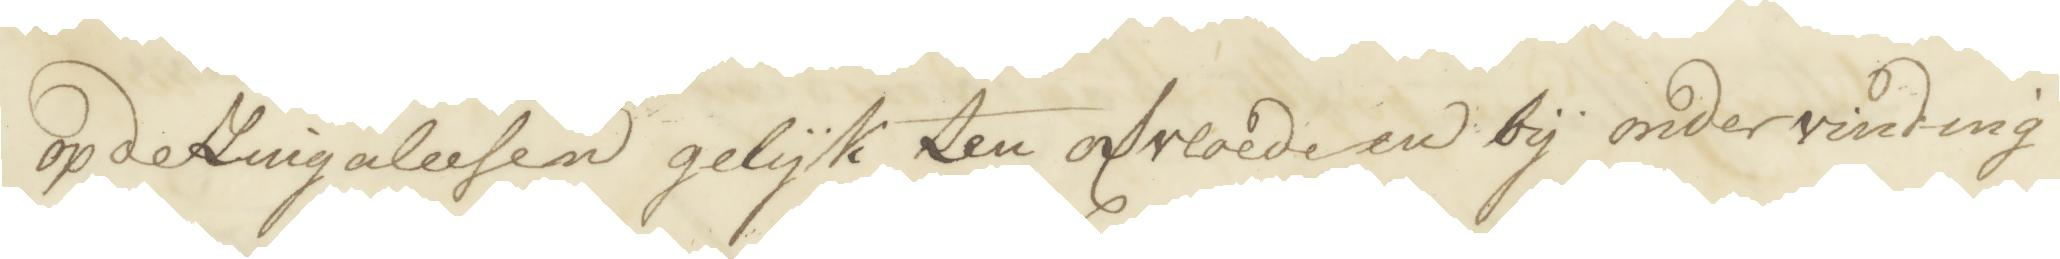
op de Zingaleesen gelijk ten overvloede en bij ondervinding
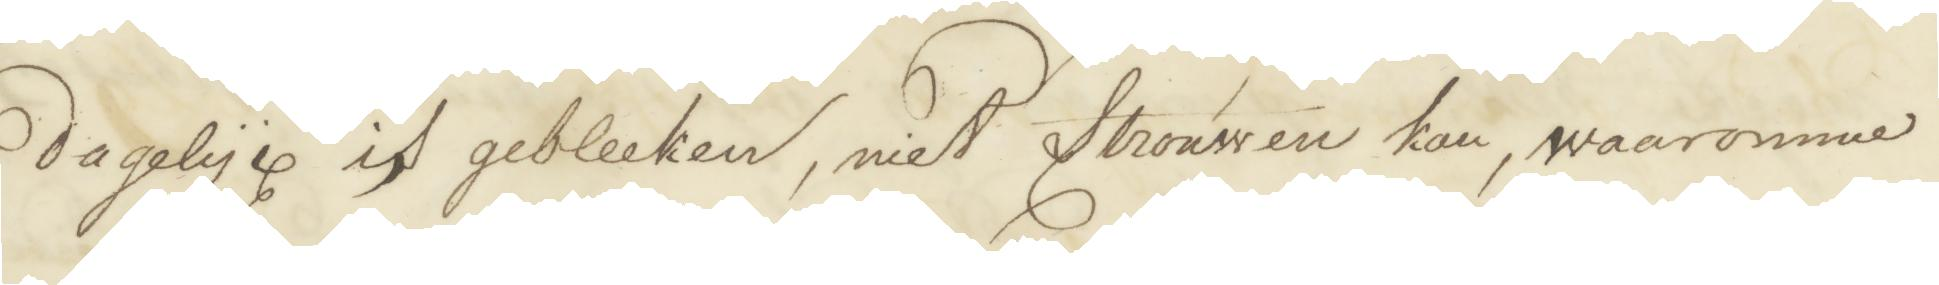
dagelijx is gebleeken, niet vertrouwen kan, waaromme
